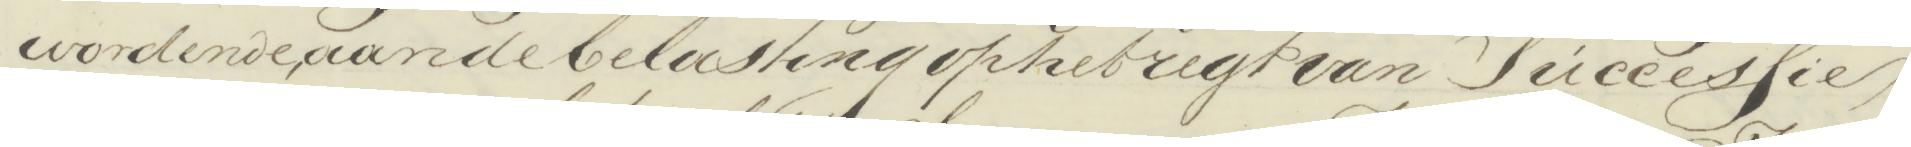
wordende aan de belasting op het regt van Successie
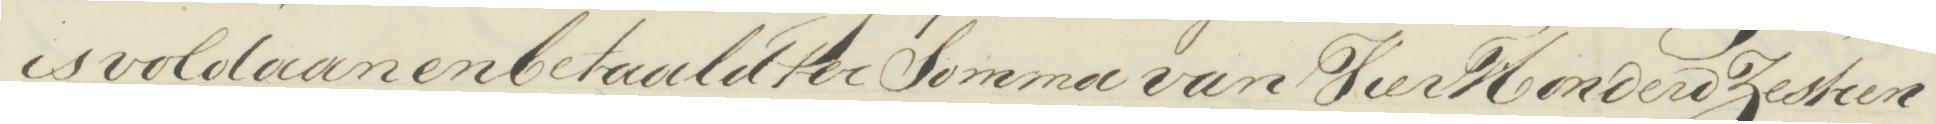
is voldaan en betaald ter somma van Vier Honderd Zestien
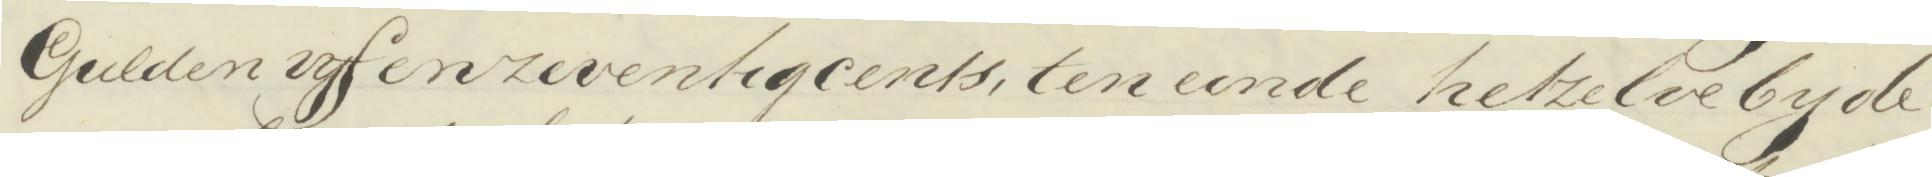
Gulden vyf en zeventig cents, ten einde hetzelve by de
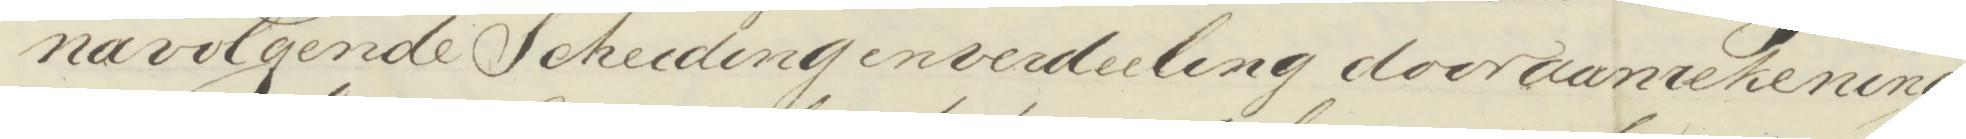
navolgende Scheiding en verdeeling door aanrekening
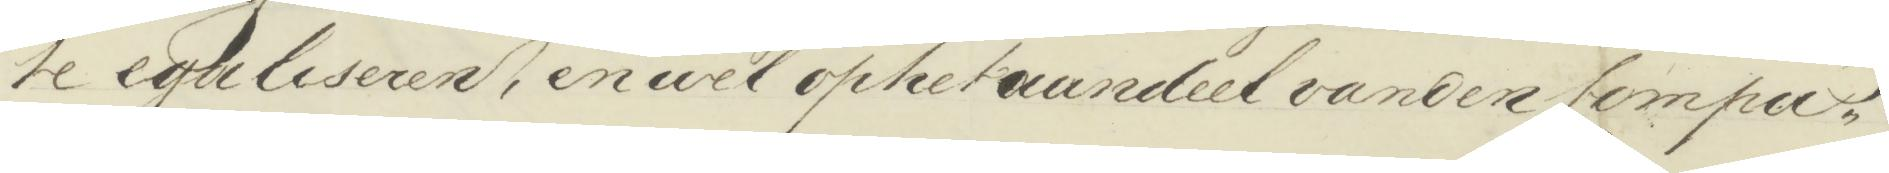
te egaliseren, en wel op het aandeel van den Compar„
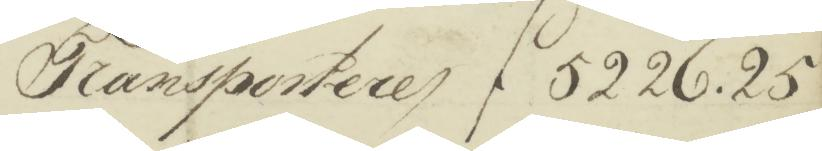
Transporteren ƒ5226.25
